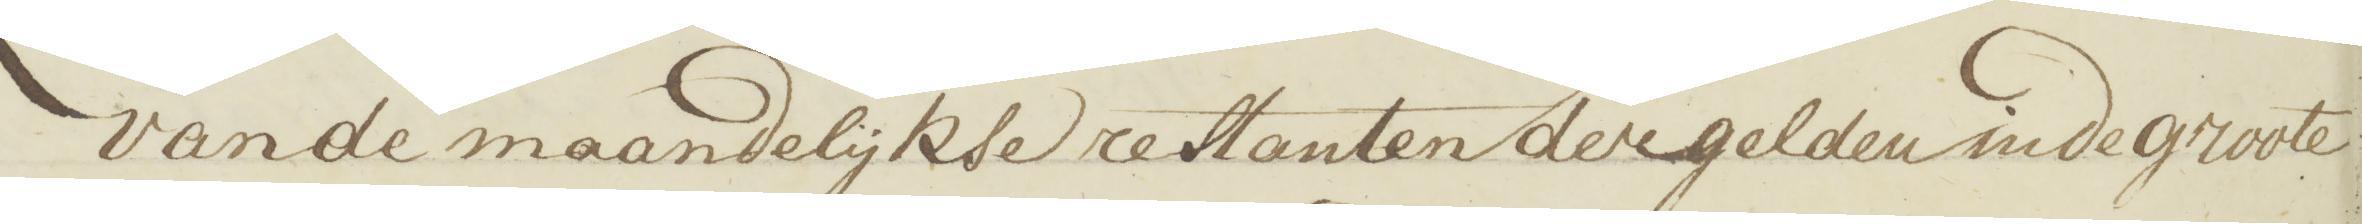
van de maandelijkse restanten der gelden in de groote
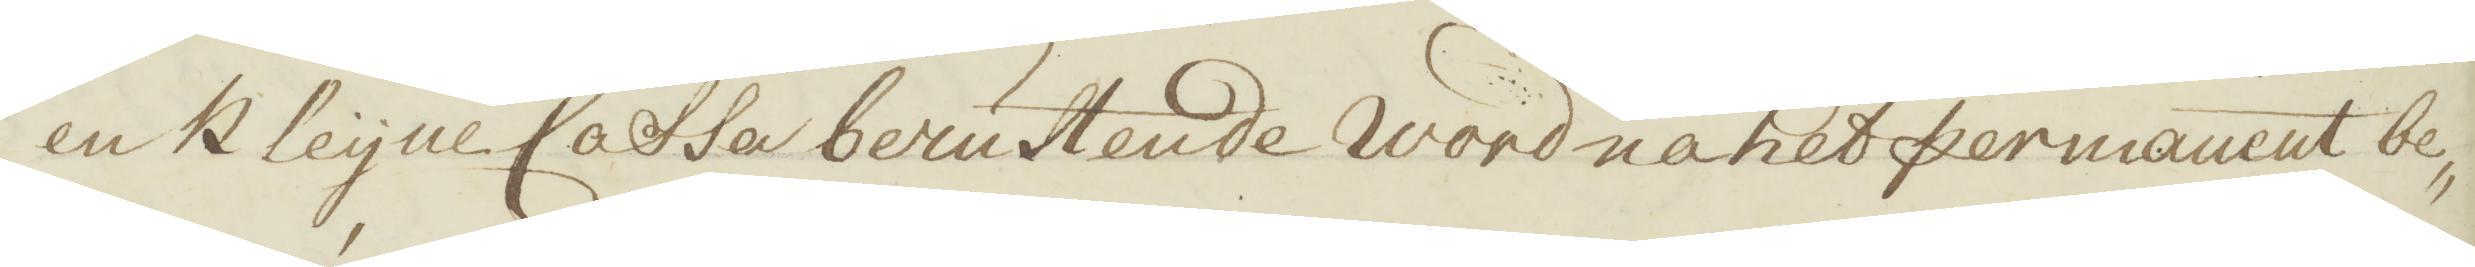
en kleijne Cassa berustende word na het permanent be„
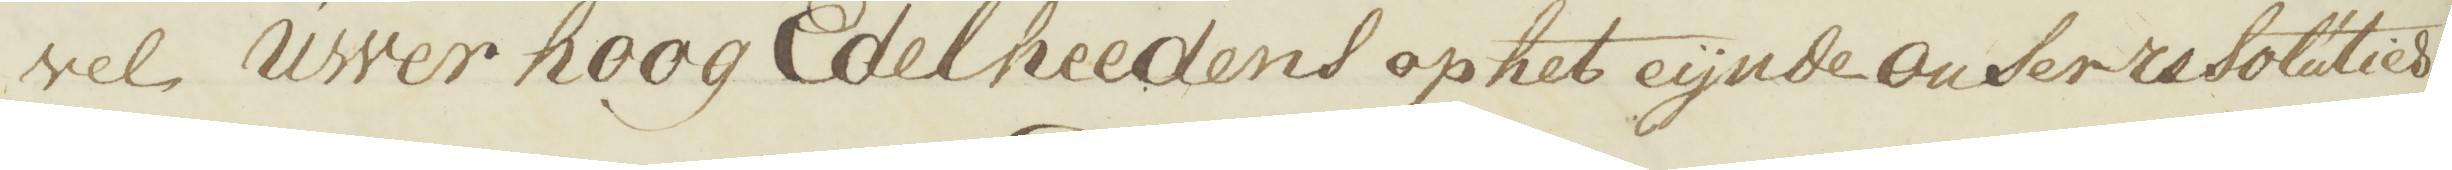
„vel uwer hoog Edelheedens op het eijnde onser resoluties
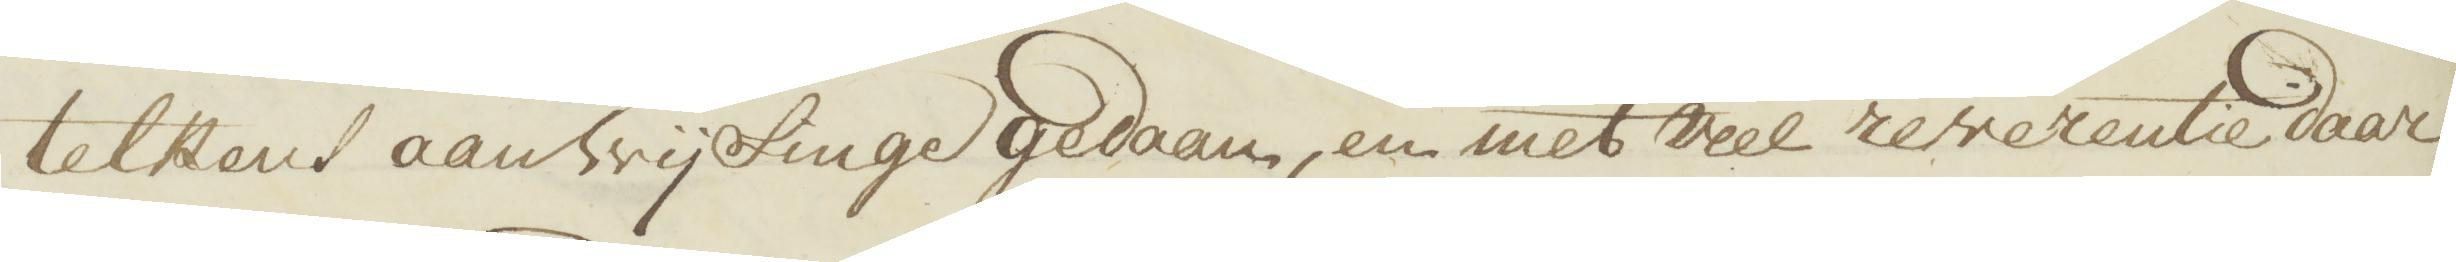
telkens aanwijsinge gedaan, en met veel reverentie daar
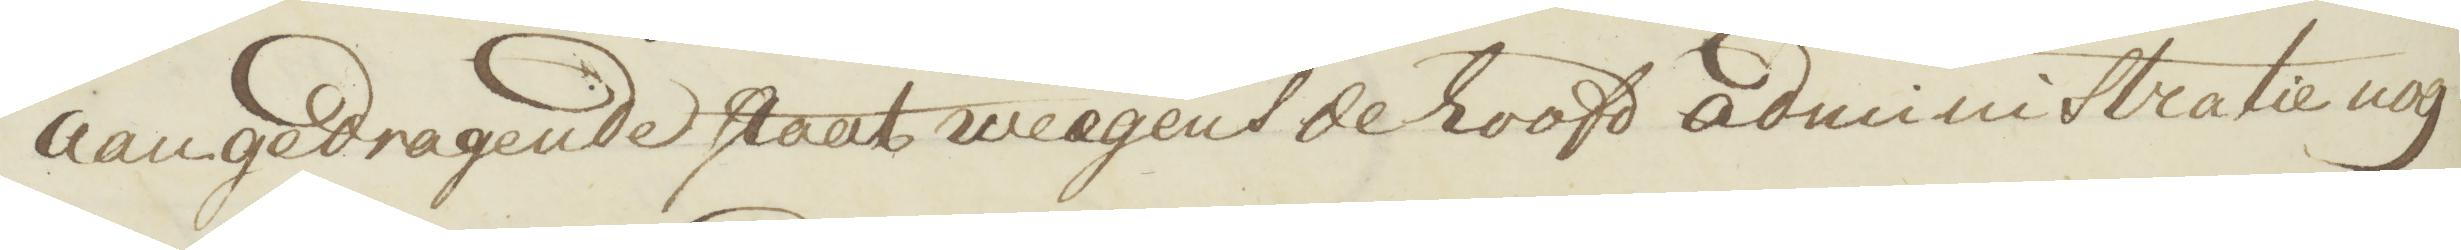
aangedragende staat weegens de hoofd administratie nog
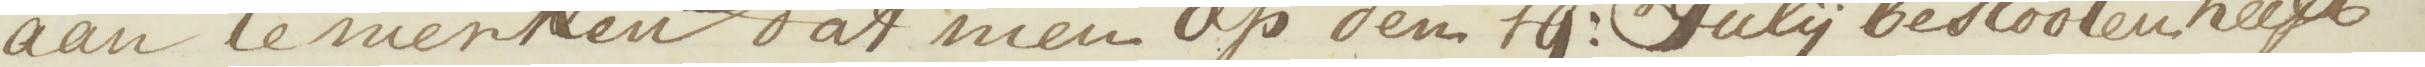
aan te merken dat men op den 19: Iulij beslooten heeft
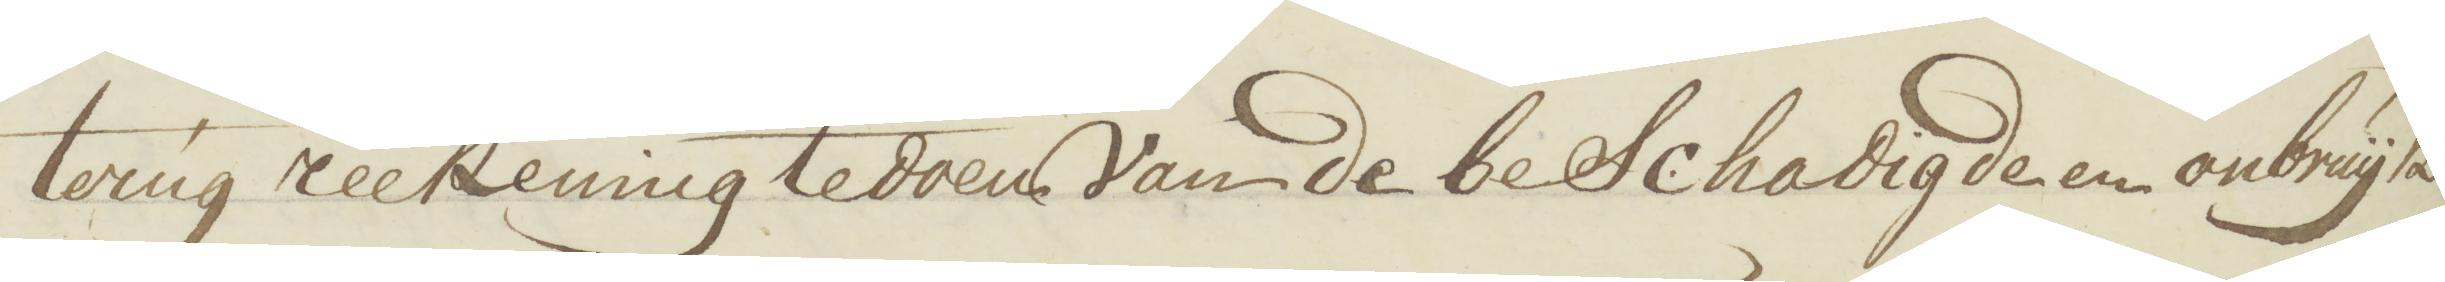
terug reekening te doen van de beschadigde en onbruijk
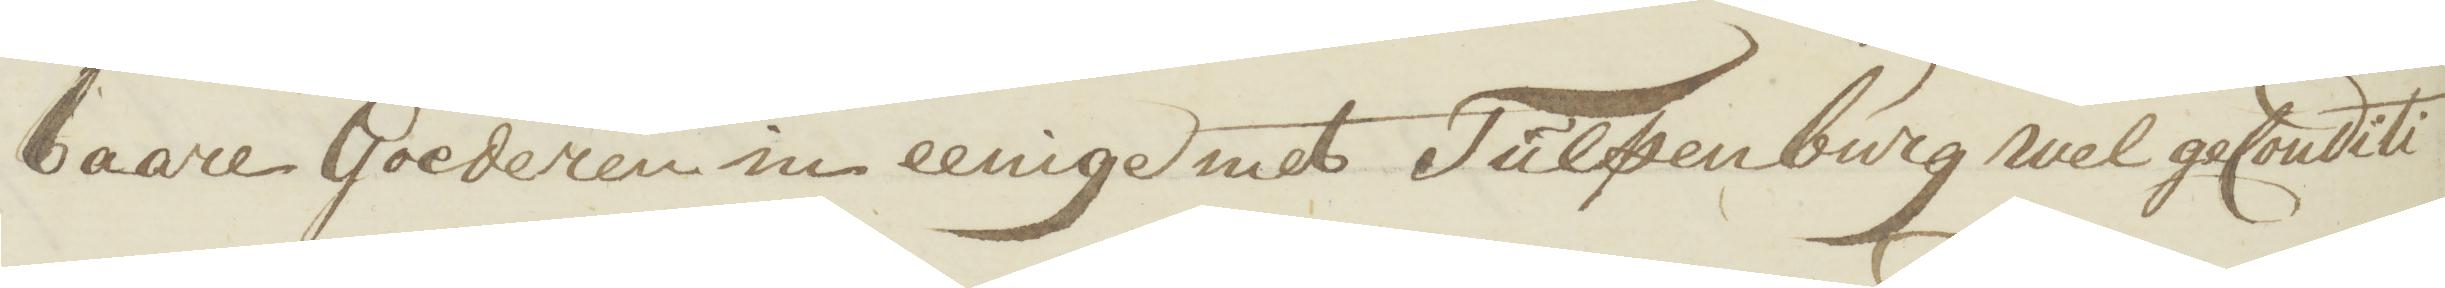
baare Goederen in eenige met Tulpenburg wel geconditi
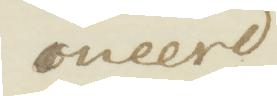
oneerd
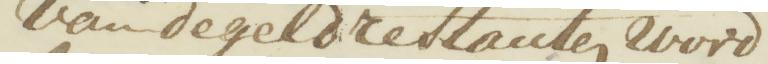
van de geldrestanten word
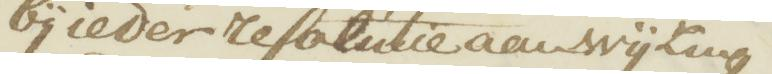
bij ieder resolutie aanwijzing
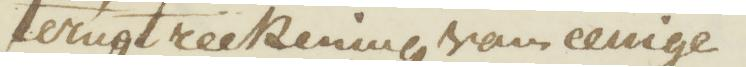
terugt reekening van eenige
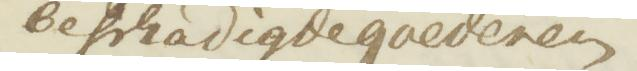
beschadigde goederen
